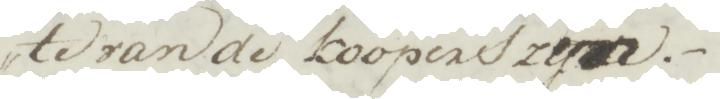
„te van de koopers zyn.
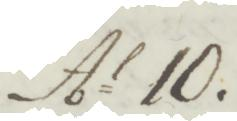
A=l 10.
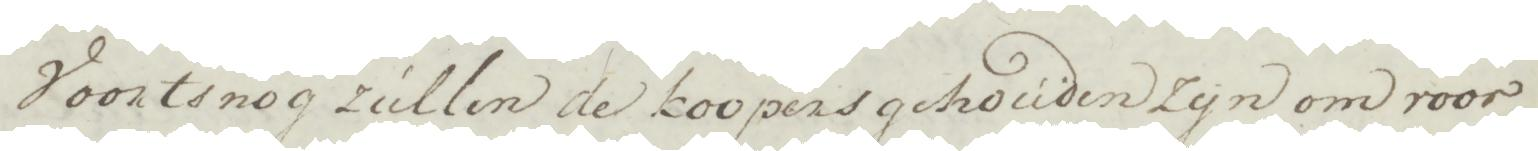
Voorts nog zullen de koopers gehouden zijn om voor
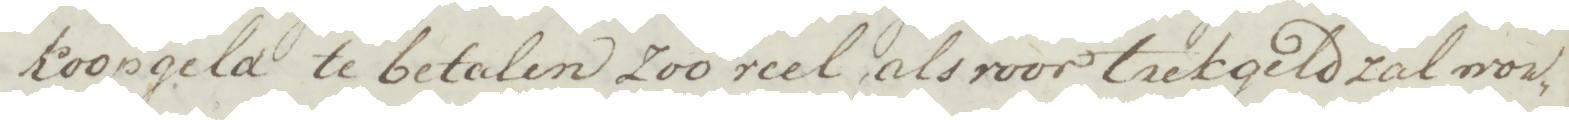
koopgeld te betalen zoo veel, als voor trekgeld zal wor„
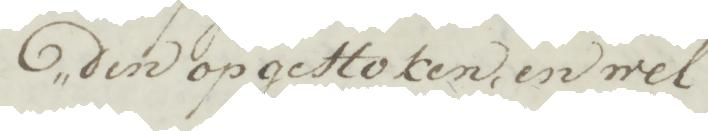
„den opgestoken, en wel
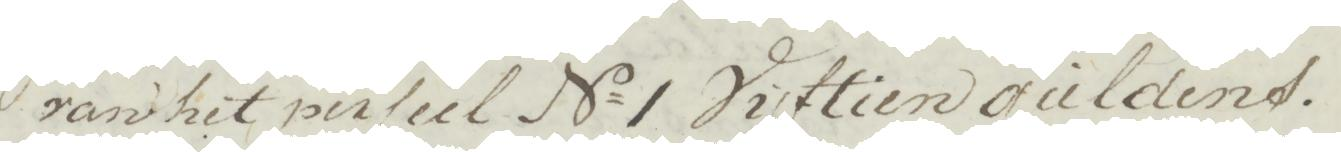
van het perseel N=o 1 Vijftien guldens.
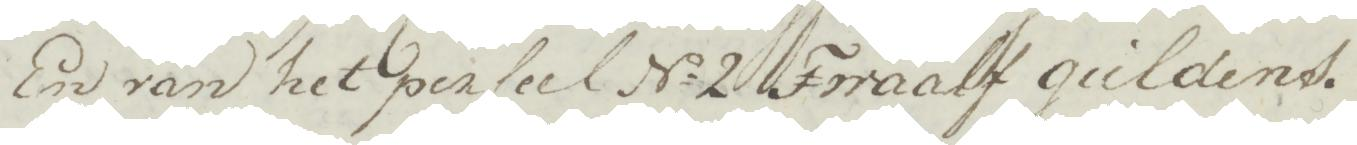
En van het perseel N=o 2 Twaalf guldens.
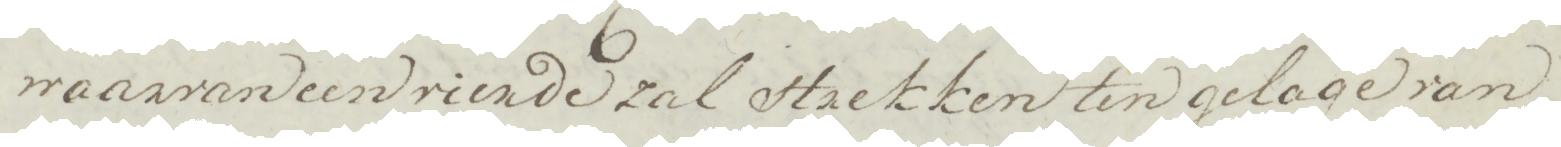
waarvan een vierde zal strekken ten gelage van
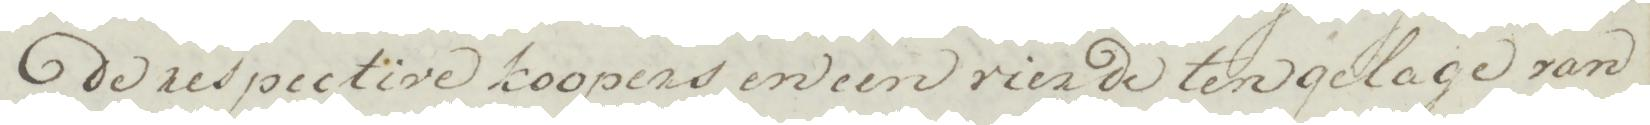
de respective koopers en een vierde ten gelage van
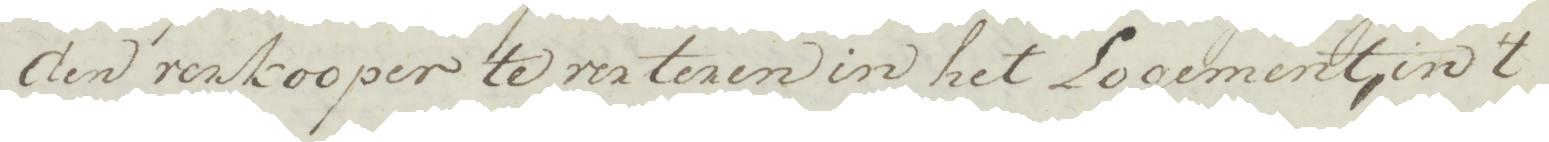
den verkooper te verteren in het Logement, in ’t
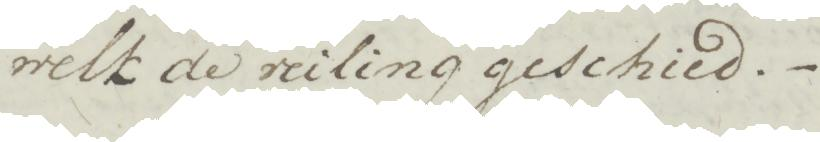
welk de veiling geschied.
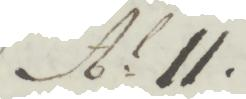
A=l 11.
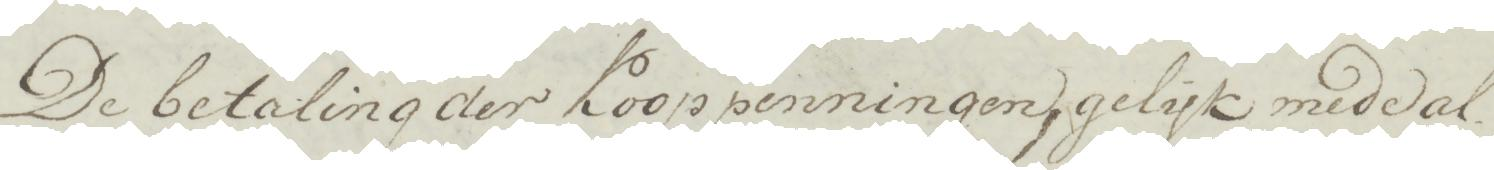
De betaling der Kooppenningen, gelijk mede al
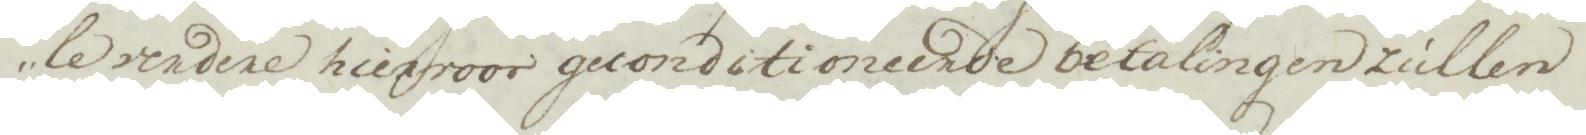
„le verdere hiervoor geconditioneerde betalingen zullen
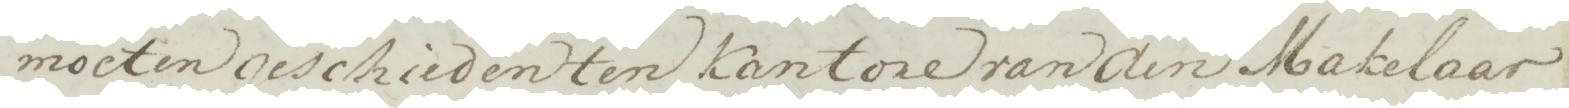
moeten geschieden ten kantore van den Makelaar
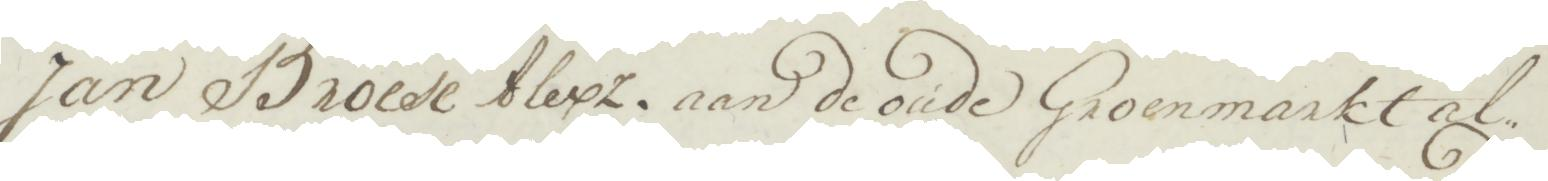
Jan Broese Alexz. aan de oude Groenmarkt al„
